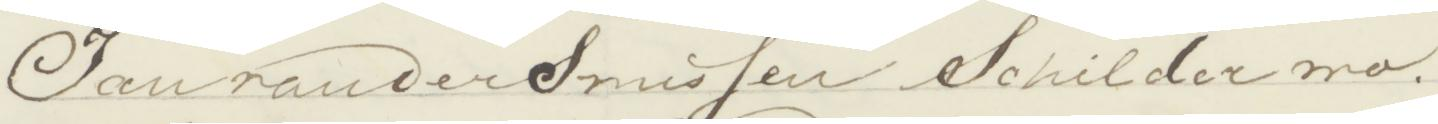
Jan van der Smissen Schilder wo,
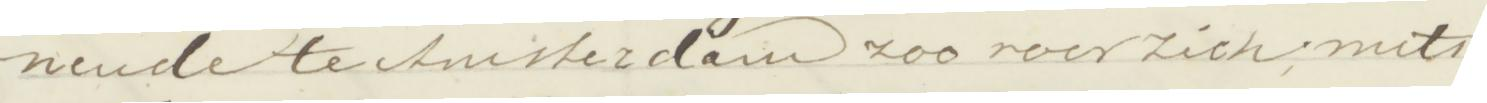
=nende te Amsterdam zoo voor zich, mits
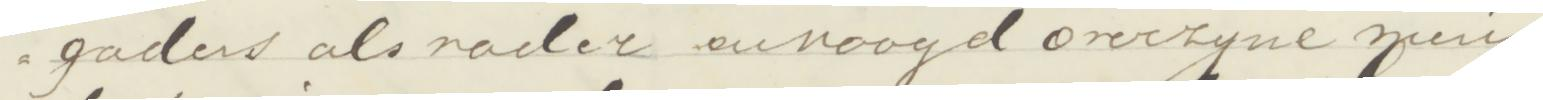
=gaders als vader en voogd over zyne min,
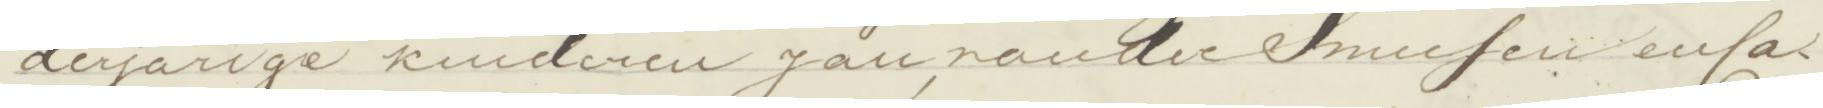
=derjarige kinderen van Jan van der Smissen en Ca,
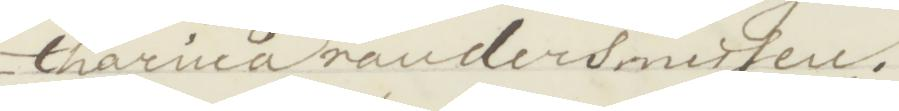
–tharina van der Smissen.
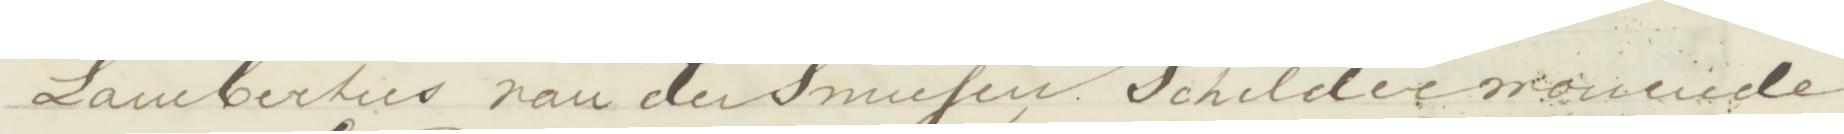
Lambertus van der Smissen Schilder wonende
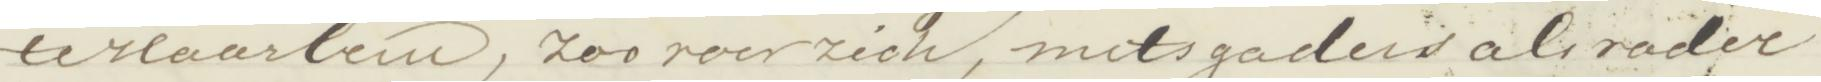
te Haarlem, zoo voor zich, mitsgaders als vader
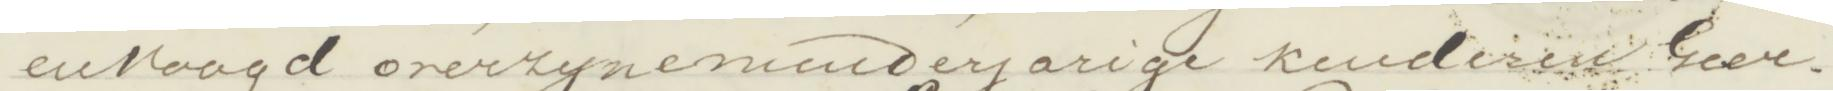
en voogd over zyne minderjarige kinderen Geer,
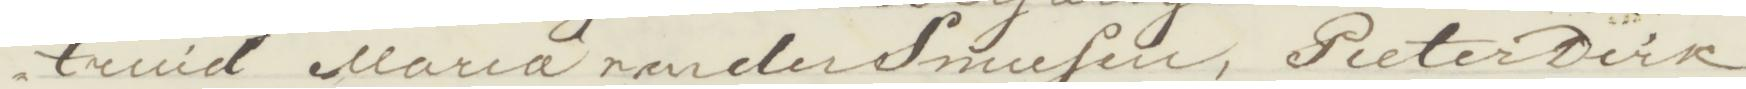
=truid Maria van der Smissen, Pieter Dirk
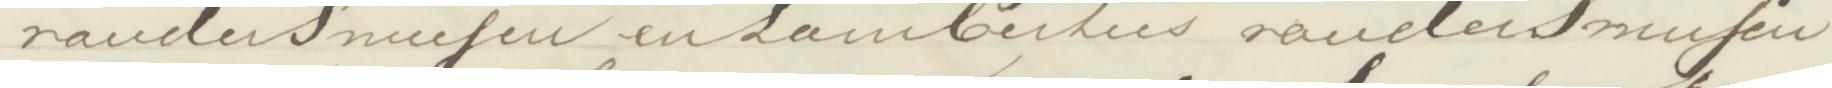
van der Smissen en Lambertus van der Smissen,
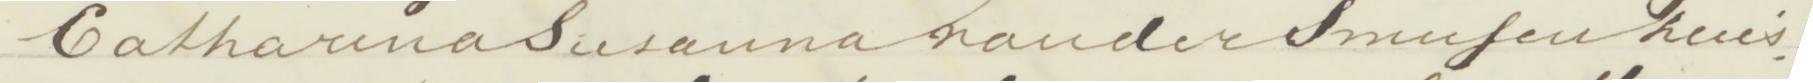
Catharina Susanna van der Smissen huis,
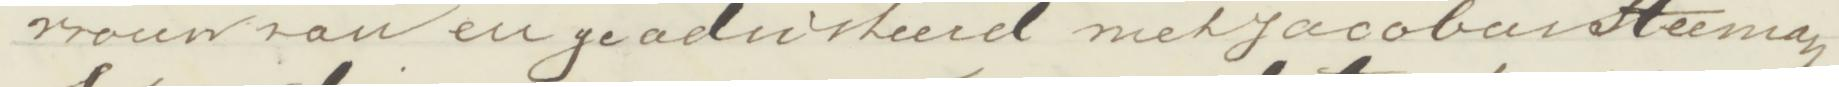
vrouw van en geadsisteerd met Jacobus Heeman
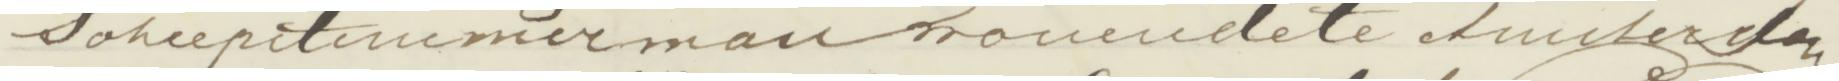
Scheepstimmerman wonende te Amsterdam
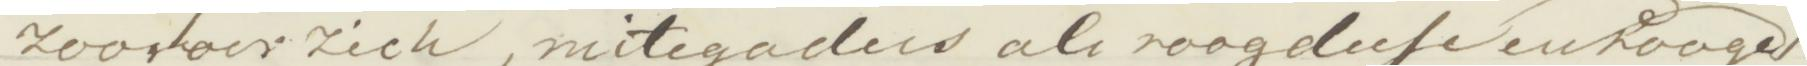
zoo voor zich, mitsgaders als voogdesse en Voogd
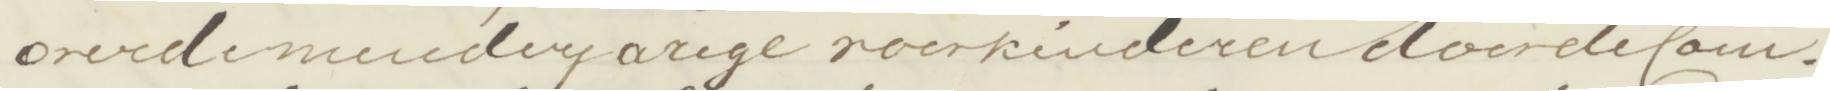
over de minderjarige voorkinderen door de Com,
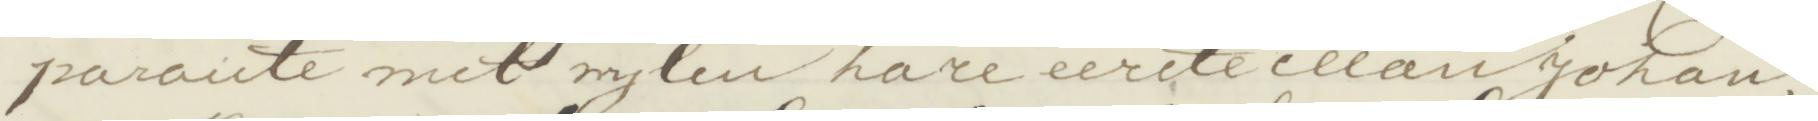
parante met wylen hare eerste Man Johan,
